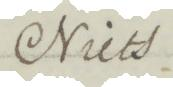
Niets
